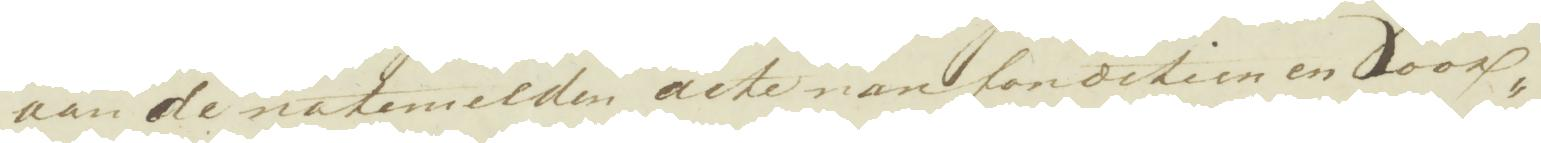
aan de na te melden acte van Conditien en Voor„
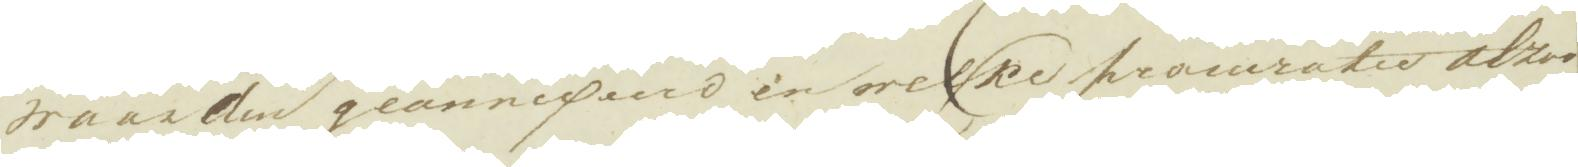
waarden geannexeerd en welke procuratie alzoo
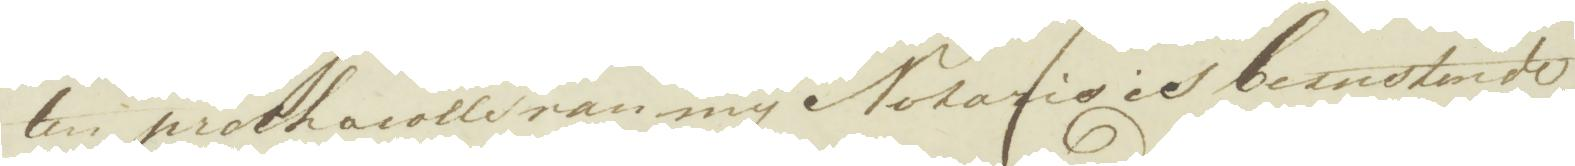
ten protocolle van my Notaris is berustende
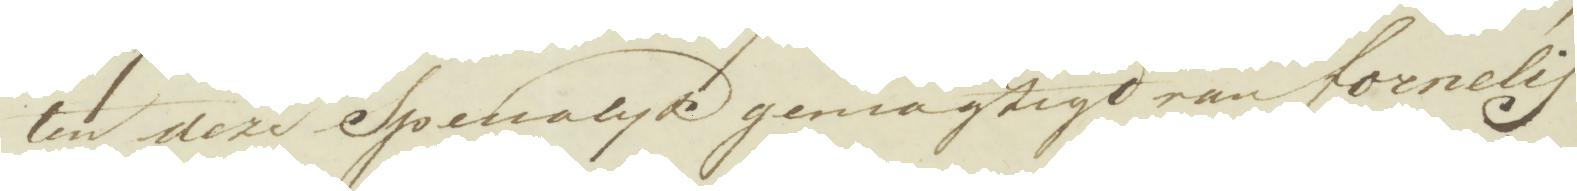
ten deze Specialyk gemagtigd van Cornelis
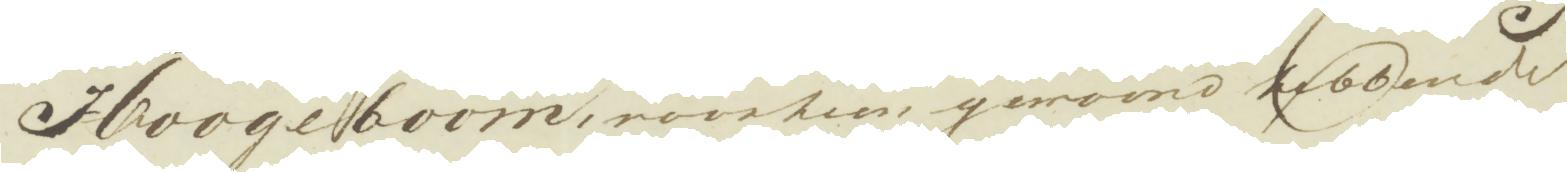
Hoogeboom, voorheen gewoond hebbende
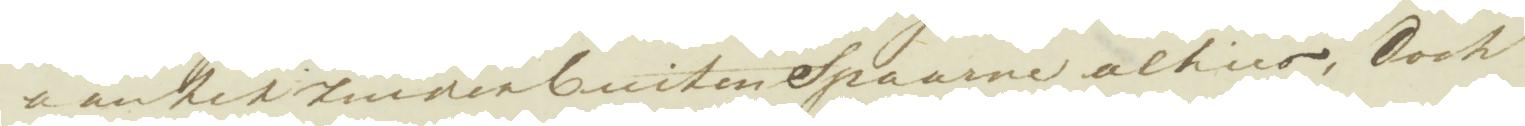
aan het zuider buiten Spaarne alhier, Doch
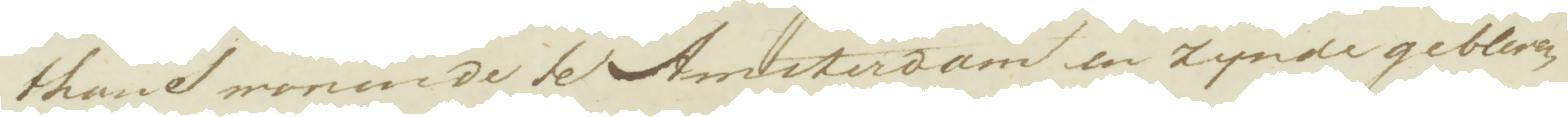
thans wonende te Amsterdam en zynde gebleven
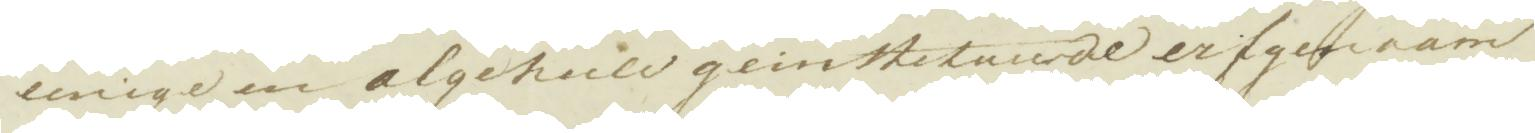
eenige en algeheele geinstitueerde erfgenaam
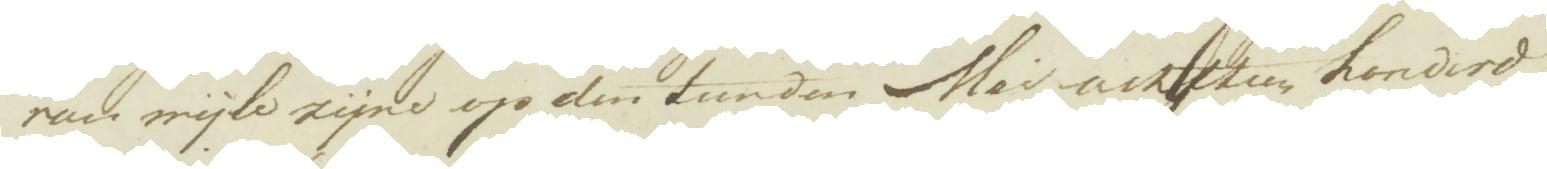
van wijle zijne op den tienden Mei achttien honderd
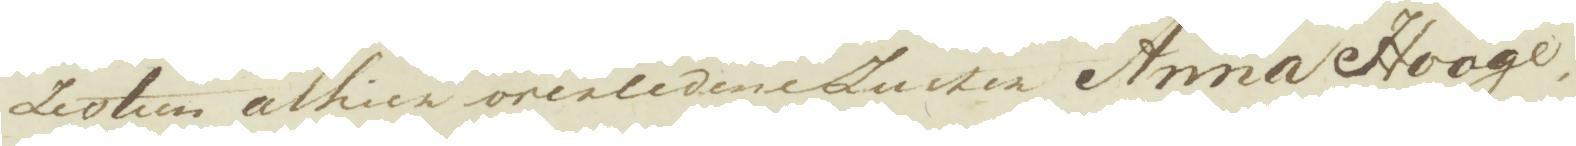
zestien alhier overledene Zuster Anna Hooge,
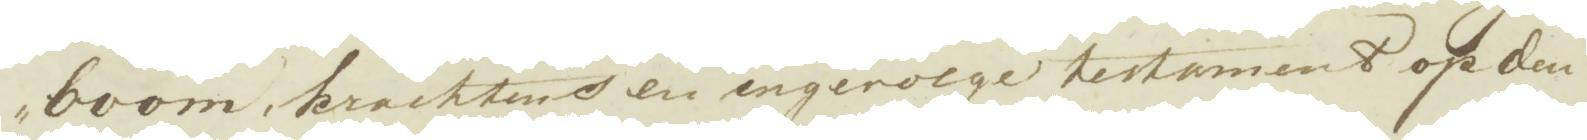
„boom, krachtens en ingevolge testament op den
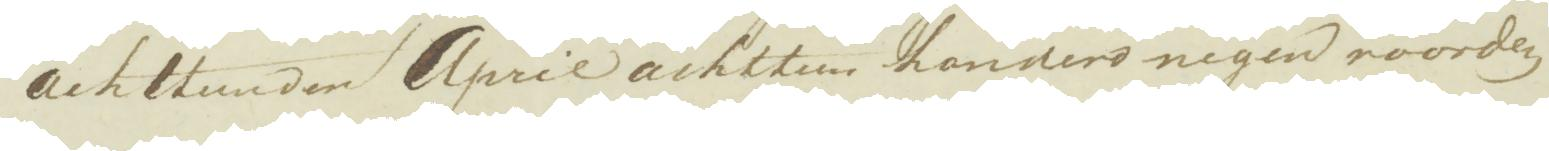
achttien den April achttien honderd negen voor den
